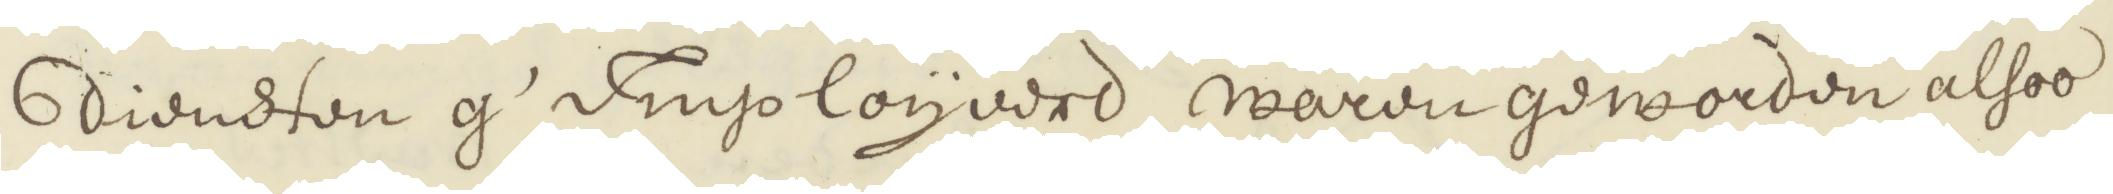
diensten g’Emploijeerd waren geworden alsoo
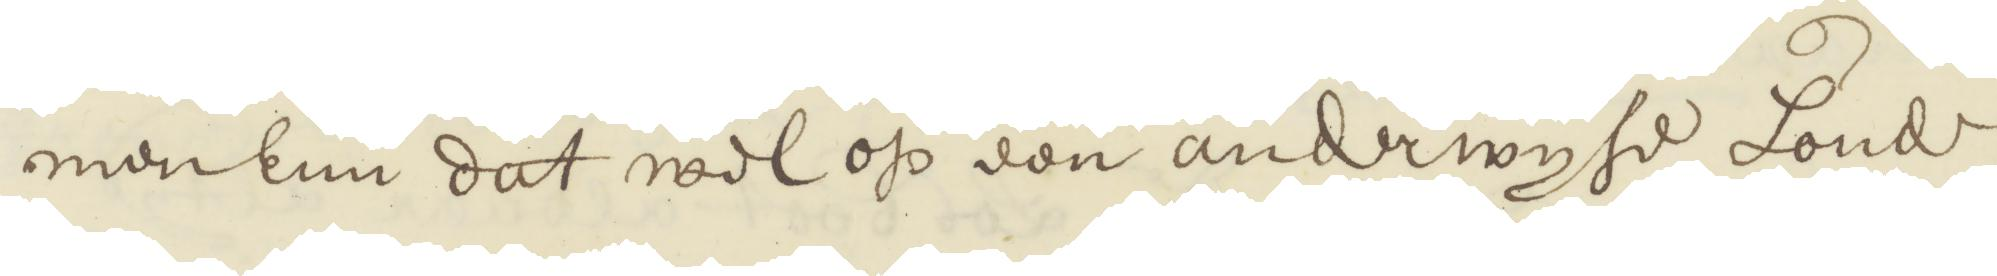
men hun dat wel op een anderwijse zoude
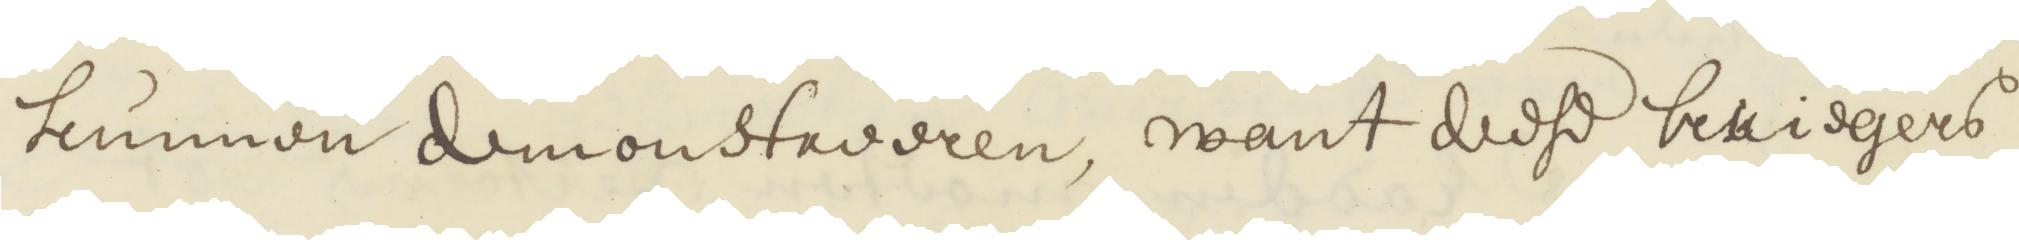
kunnen demonstreeren, want deese kriegers
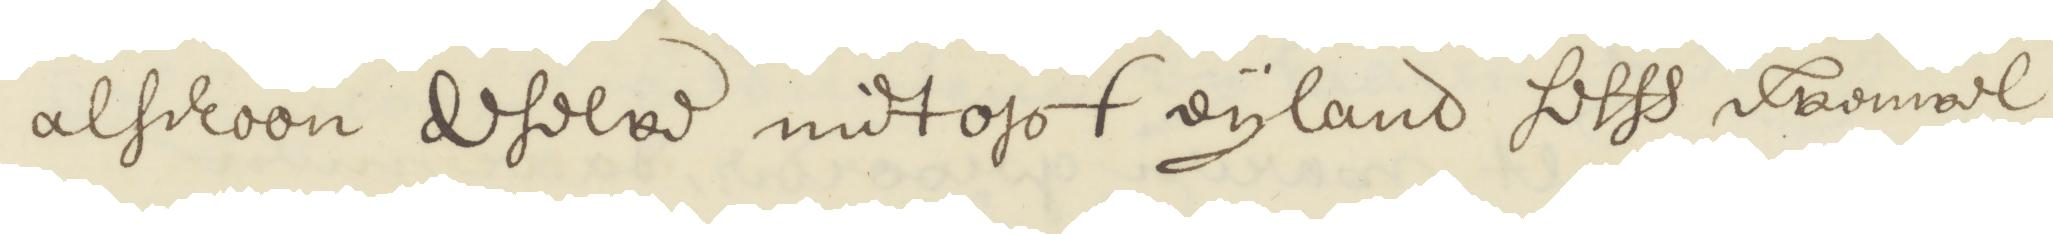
alschoon deselve niet op 't eijland selfs Evenwel
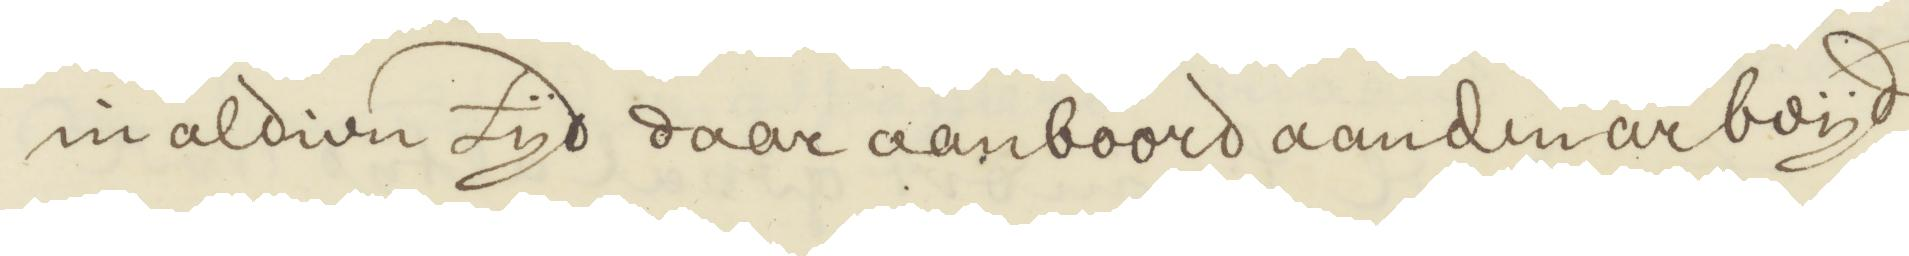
in aldien tijd daar aanboord aan den arbeijd
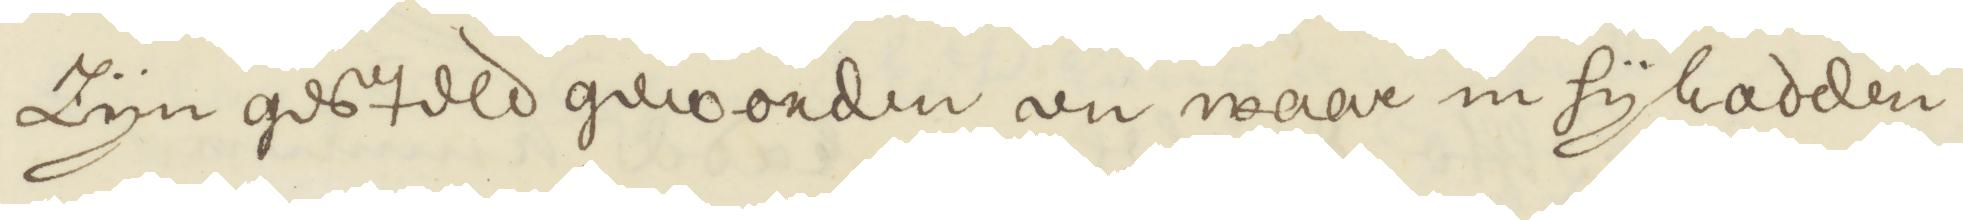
Zijn gesteld geworden en waar in sij hadden
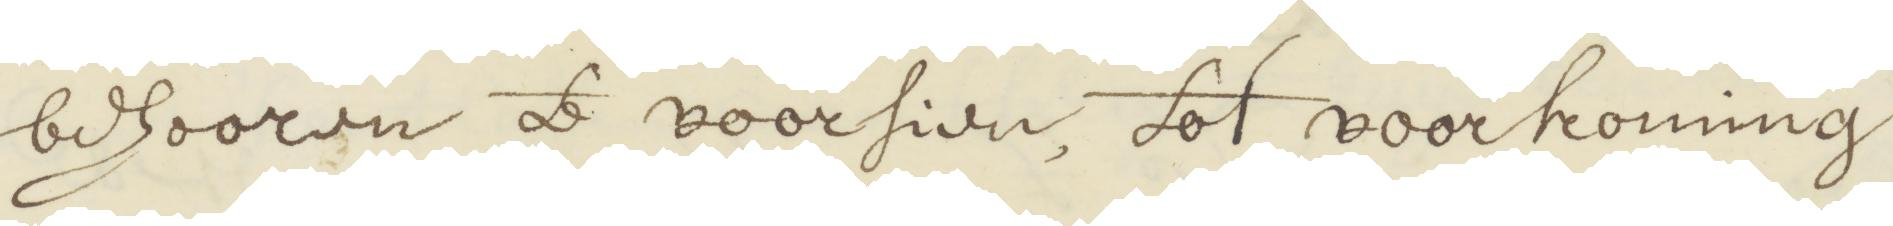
behooren te voorsien, tot voorkoming
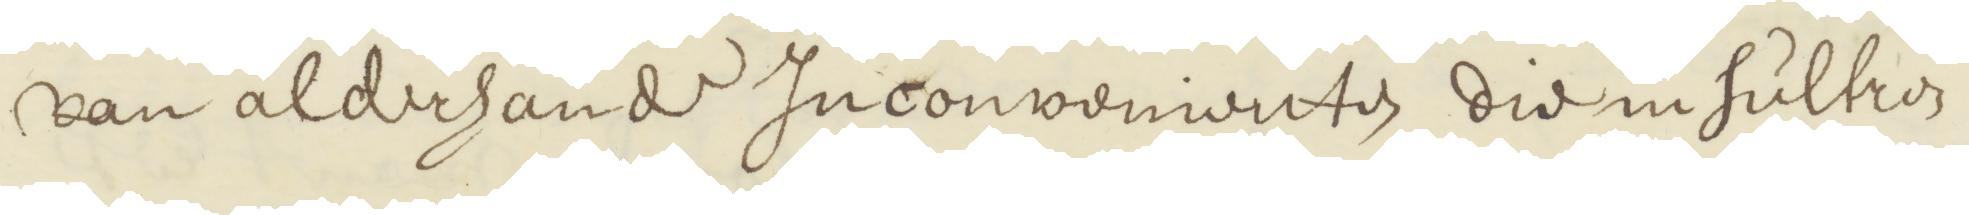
van alderhande Jnconvenienten die in sulken
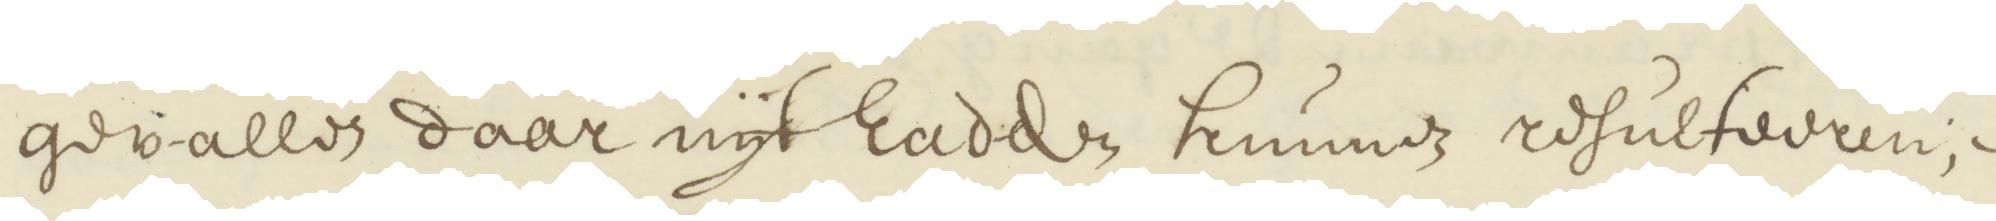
gevallen daar uijt hadden kunnen resulteeren;
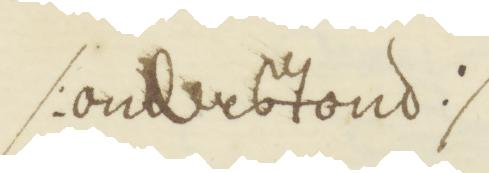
/.onderstond:/
